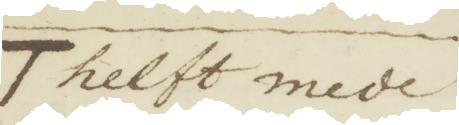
¶ helft mede
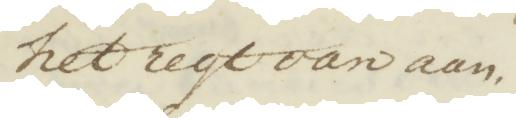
het regt van aan,
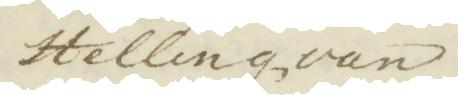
stelling van
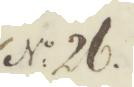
N:o 26.
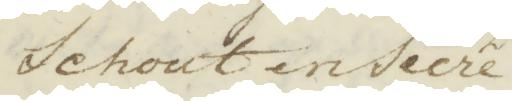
Schout en Secre
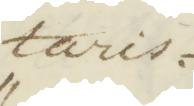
taris
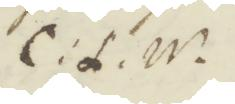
C: L. W.
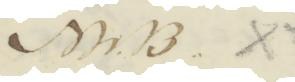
Nv. B.
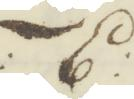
T:E:
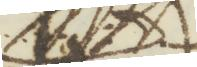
WAH.
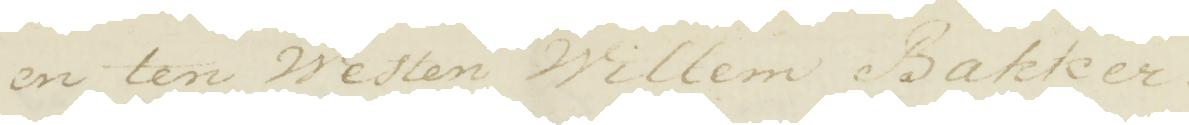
en ten Westen Willem Bakker
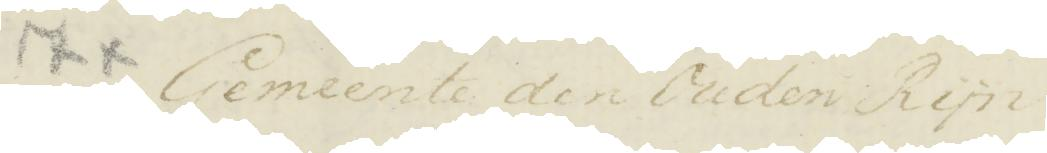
Gemeente den ouden Rijn
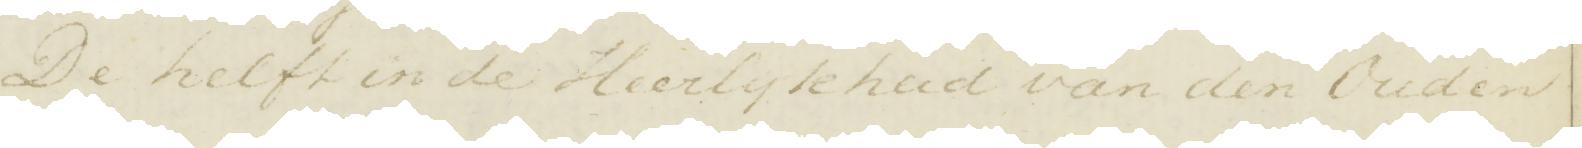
De helft in de Heerlykheid van den Ouden
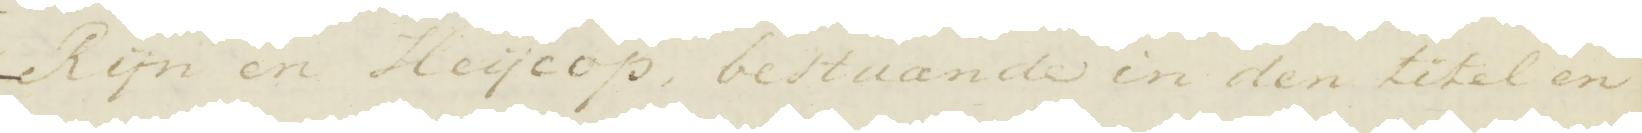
Rijn en Heijcop, bestaande in den titel en
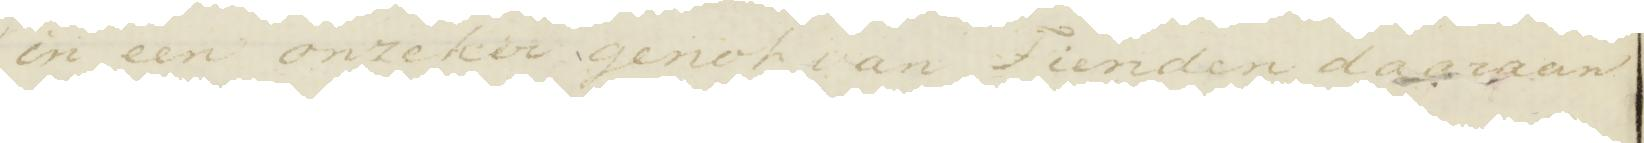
in een onzeker genot van Tienden daaraan
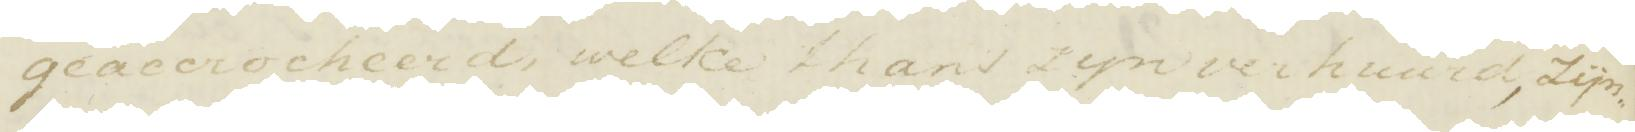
geaccrocheerd, welke thans zyn verhuurd, zijn„
